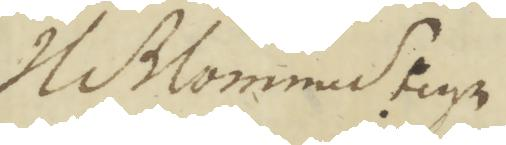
H Blommesteyn
